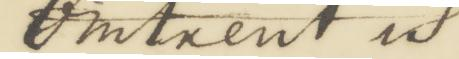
Omtrent is
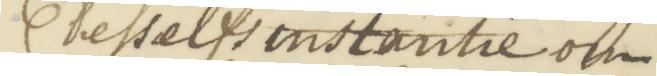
desselfs instantie om
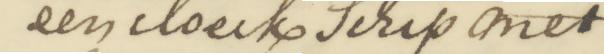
een cloeck schip met
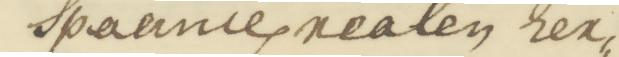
spaanse realen her„
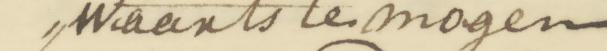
„waarts te mogen
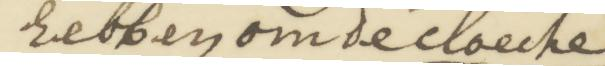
hebben om de cloecke
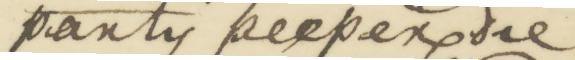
partij peeper die
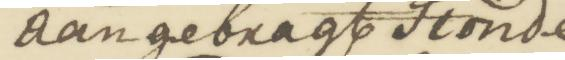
aan gebragt stonde
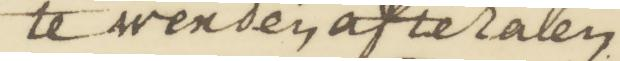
te werden aftehalen
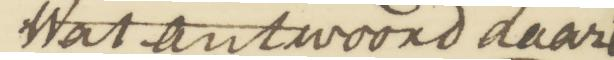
wat antwoord daar
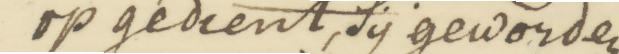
op gedient, sij geworden
